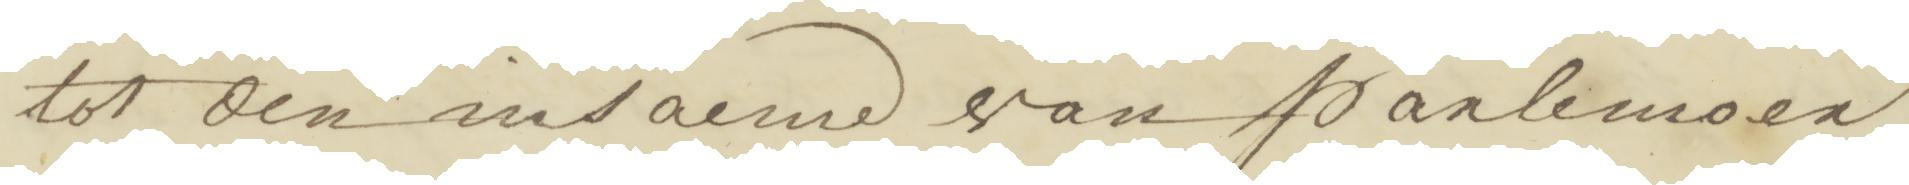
tot den insaeme van parlemoer
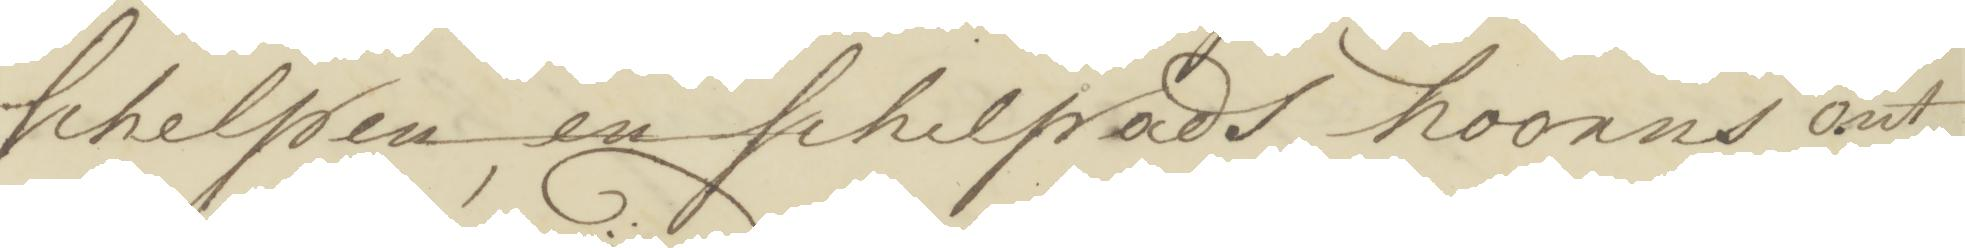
Schelpen, en Schilpads hoorns ont
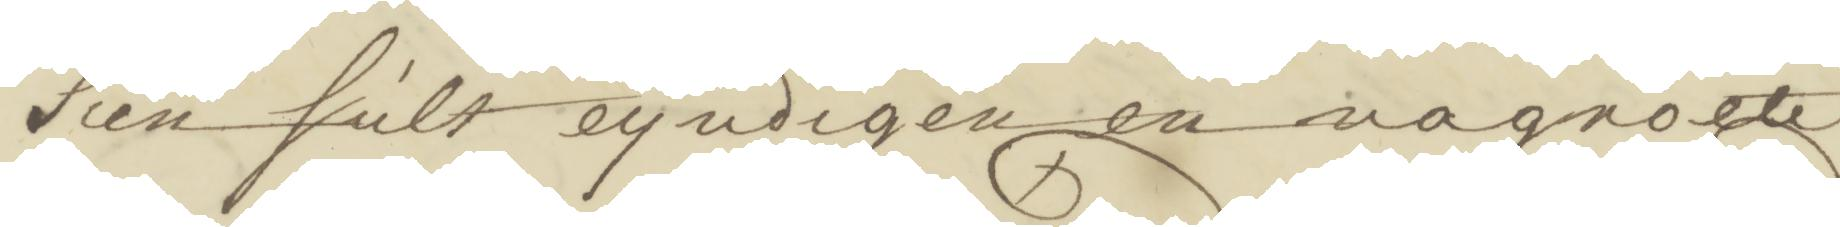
Sien Sult eijndigen en na groete
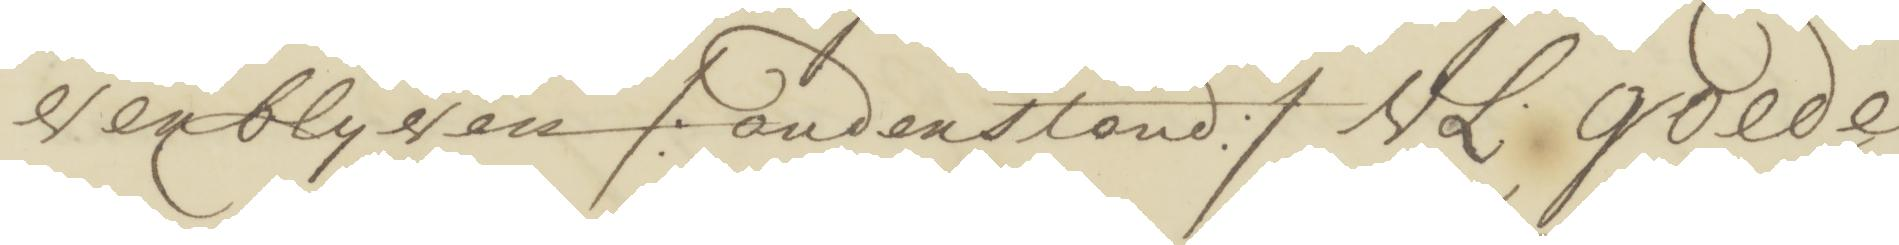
verblijven /: onderstond :/ UL: goede
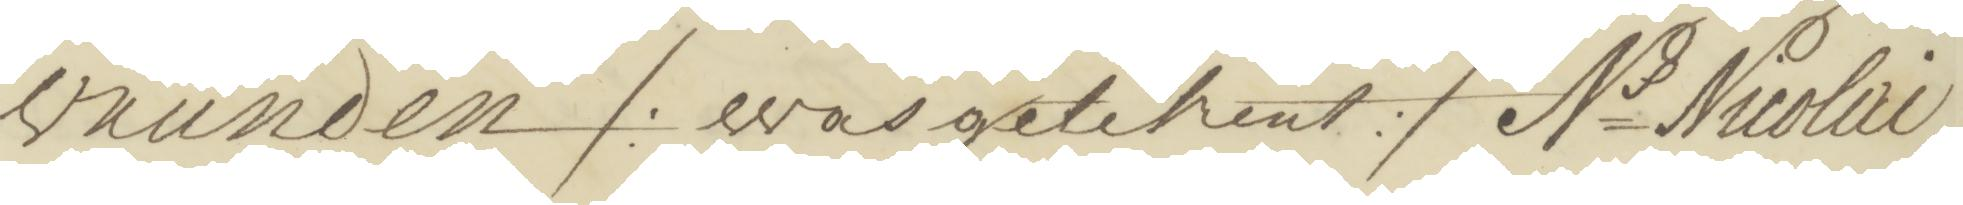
vrunden /: was getekent :/ N=s Nicolai,
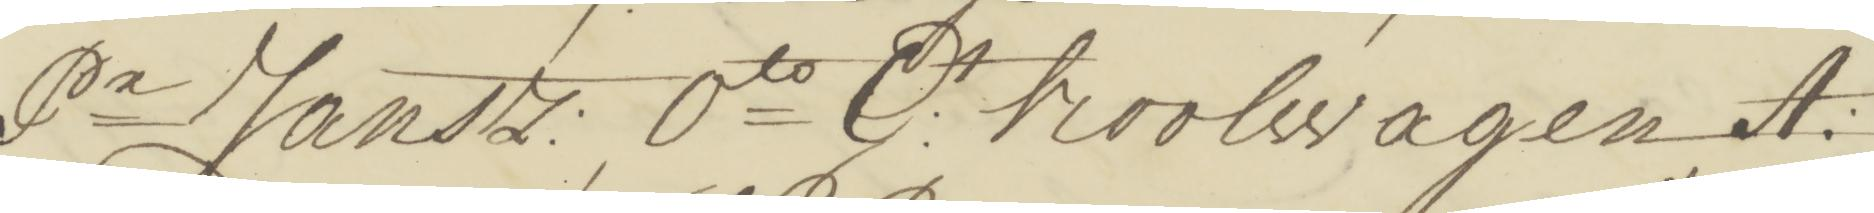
P=r Jansz:, O=to E:t Koolwagen A:t
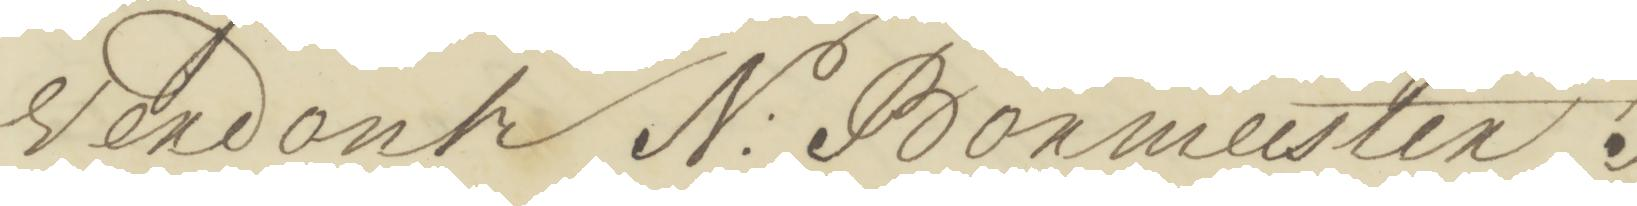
Verdonk N: Bormeester J=s
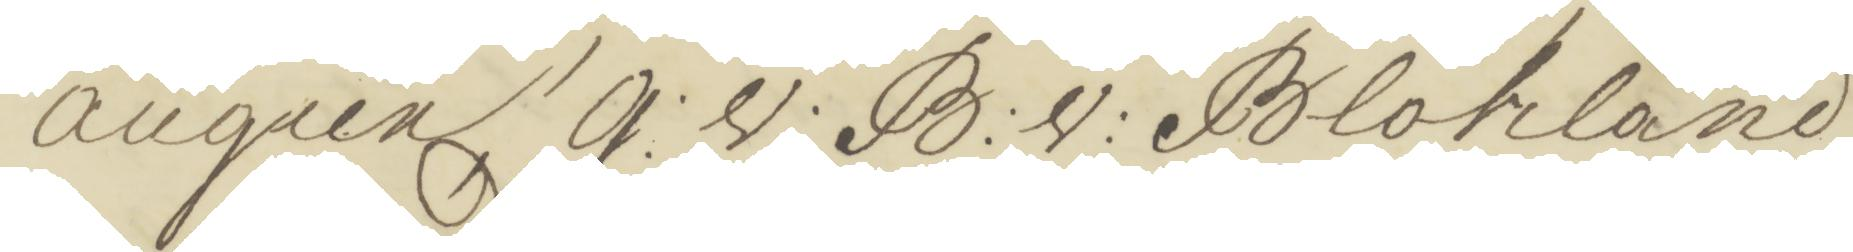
Augier g: v: B: v: Blokland,
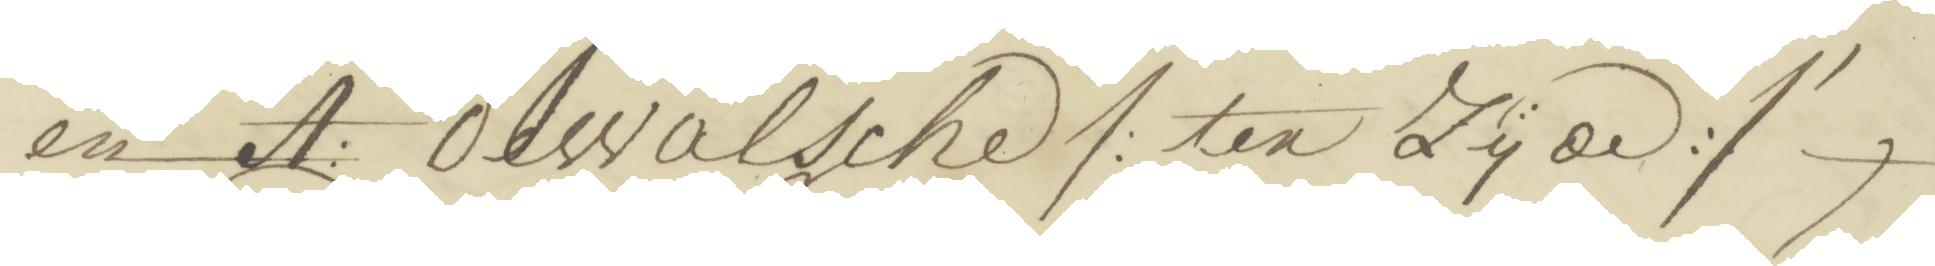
en A: dewalsche /: ter Zijde :/ ,
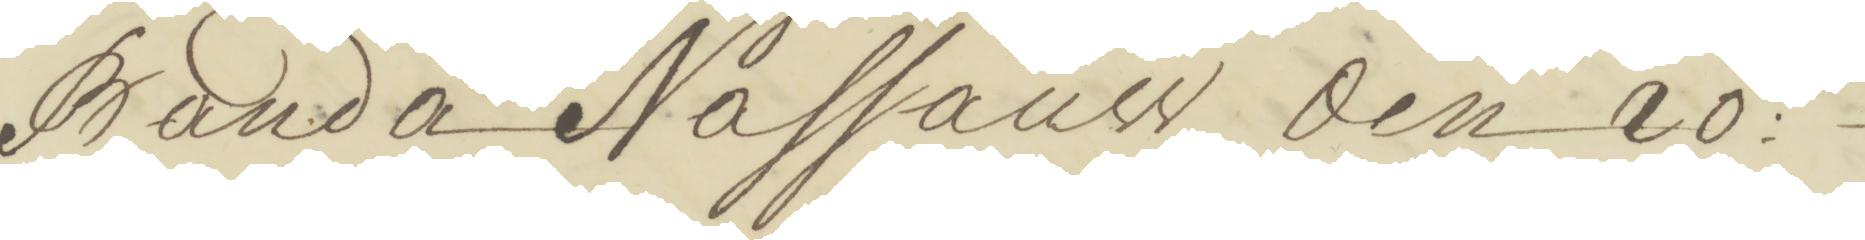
Banda Nassauw den 20:
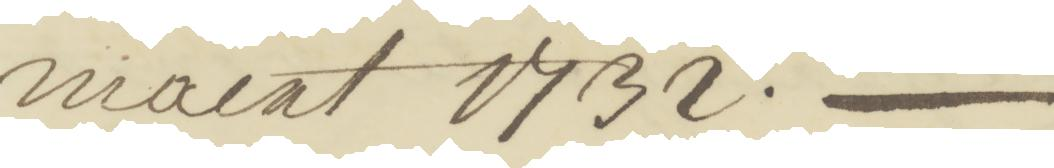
maert 1732.—
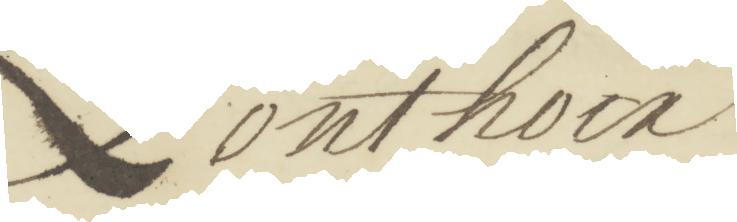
Lonthoir
